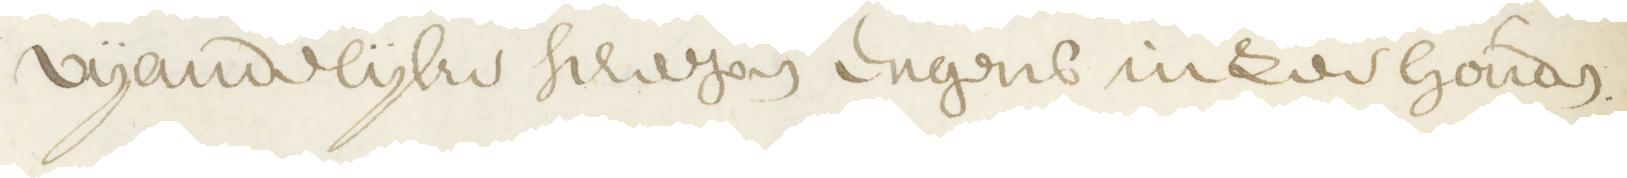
vijandelijke scheepen Ergens in zee houden
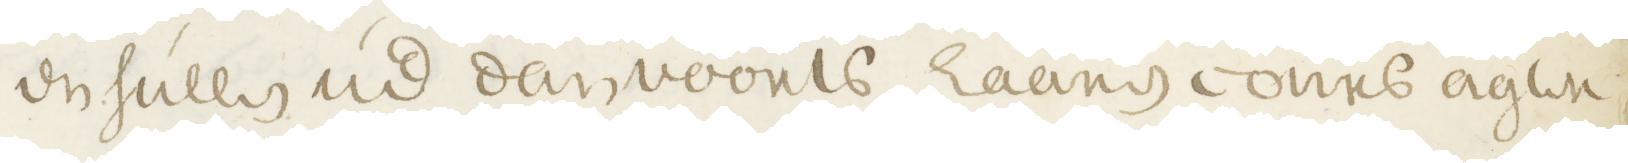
en sullen uE dan voorts haaren cours agter
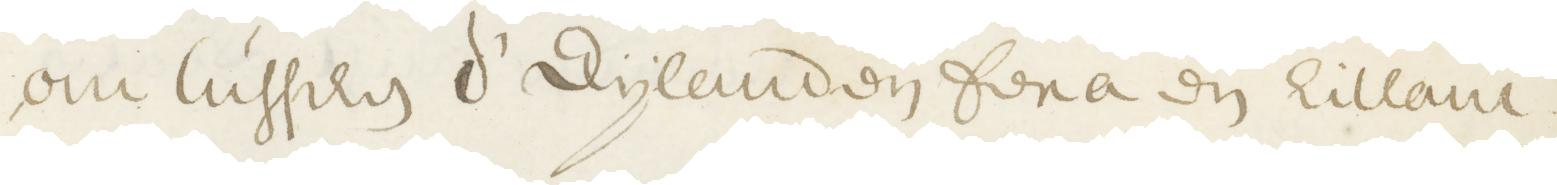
om tusschen d’ Eijlanden fera en hitlam
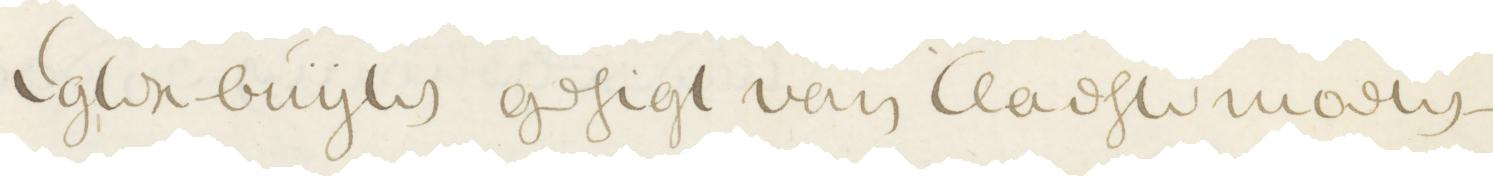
Egter buijten gesigt van 'tlaeste moeten
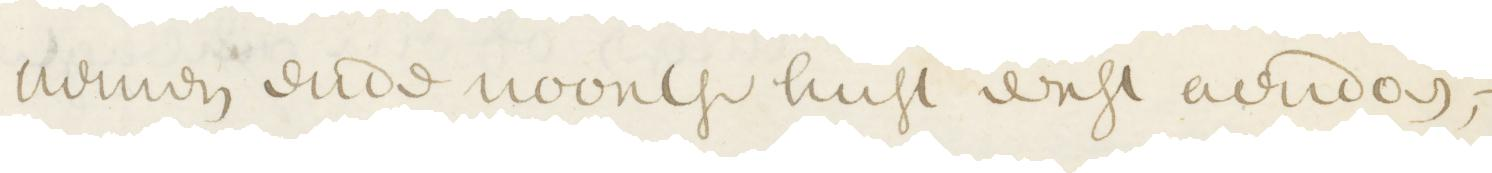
nemen ende noortse kust eerst aendoen,
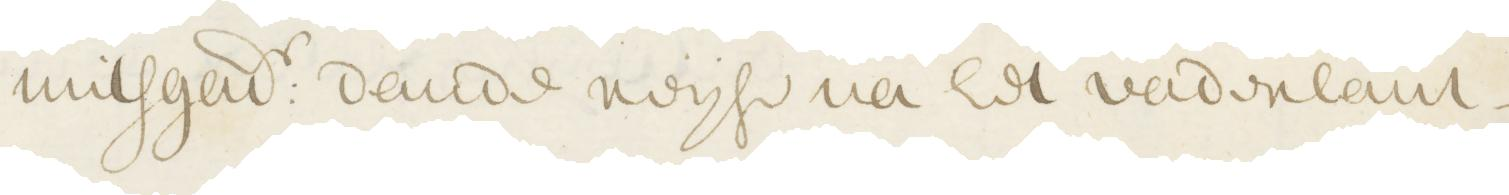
mitsgad:s dande reijse na het vaderlant
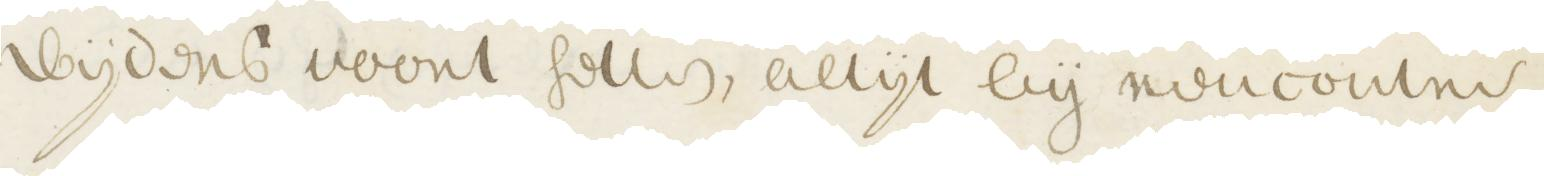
wijders voort setten, altijt bij rencontre
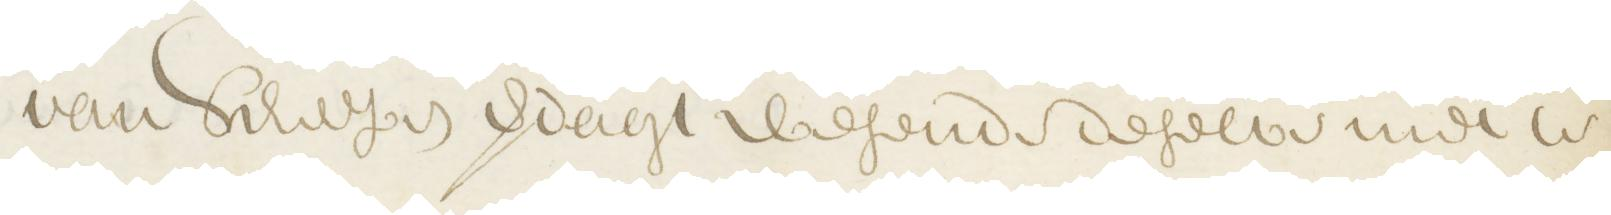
van Scheepen verdagt wesende deselve niet te
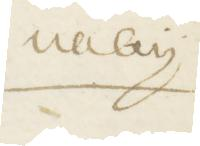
nabij
